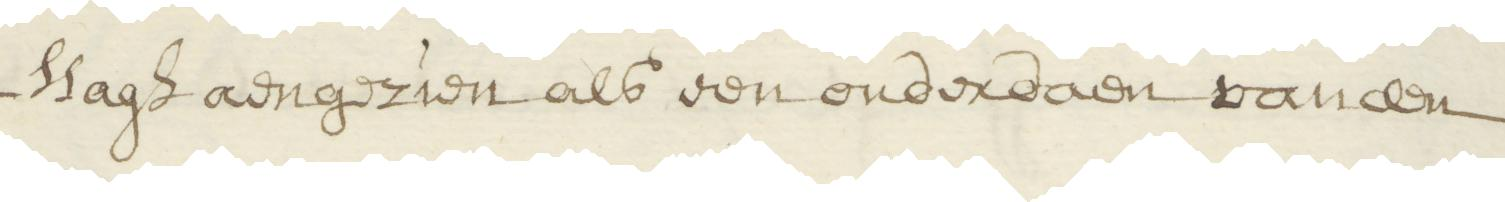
slagh aengezien als een onderdaen van den
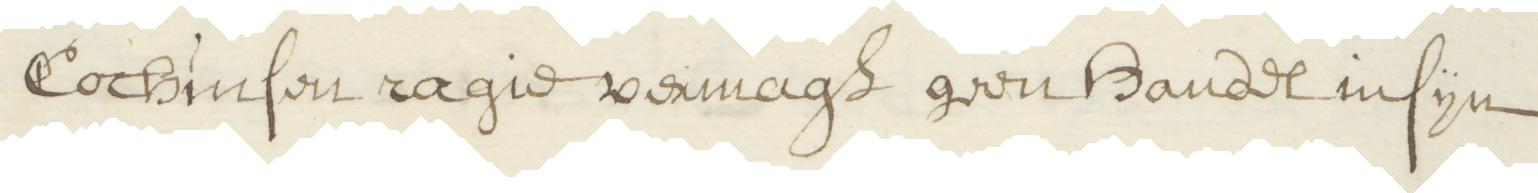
Cochinsen ragie vermagh geen handel in sijn
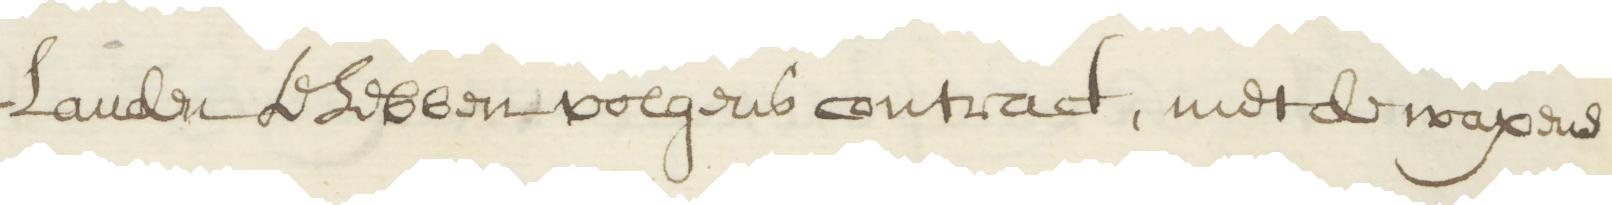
landen te hebben volgens contract, met de wapens
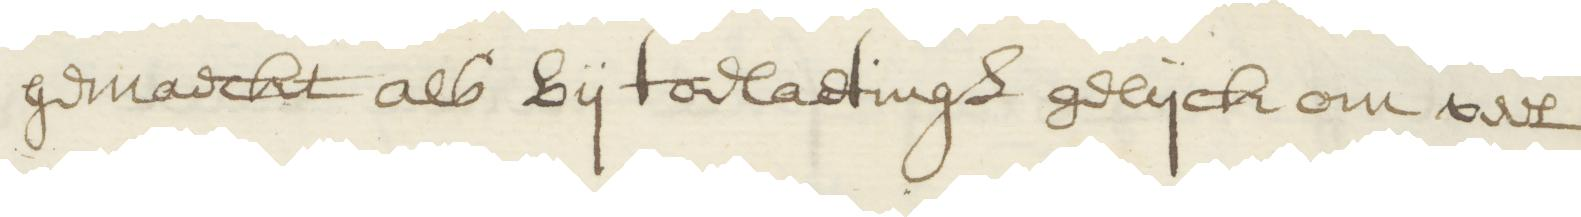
gemaeckt als bij toelastingh gelijck om veel
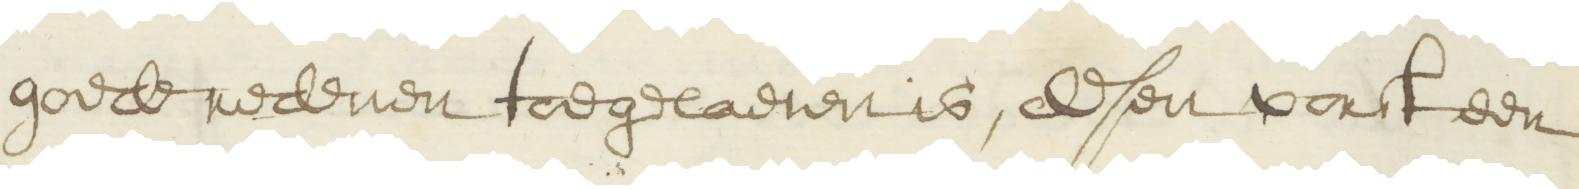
goede redenen toegelaeten is, desen vorst een
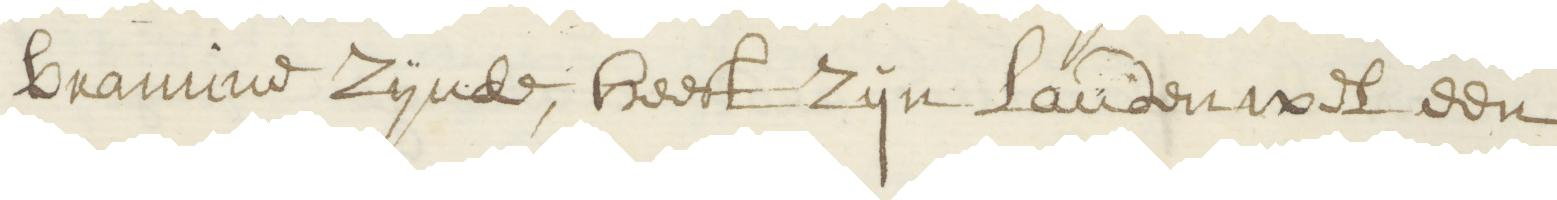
bramine zijnde, heeft zijn landen wel een
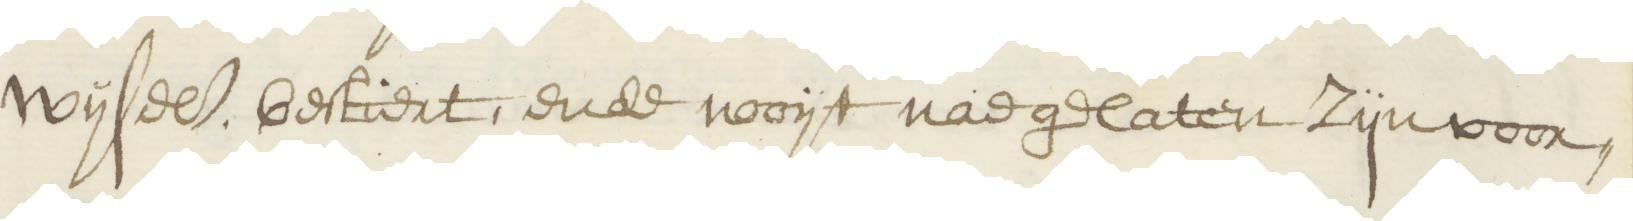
wijselijk bestiert, ende nooijt nae gelaten zijn voor„
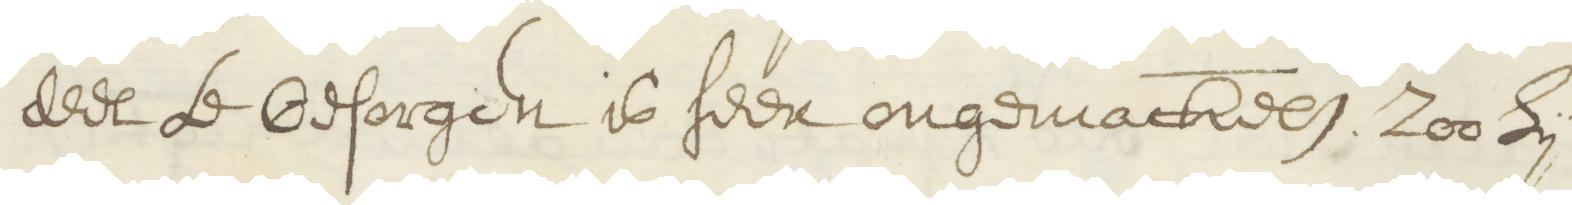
deel te besorgen is seer ongemackelijk zoo hij
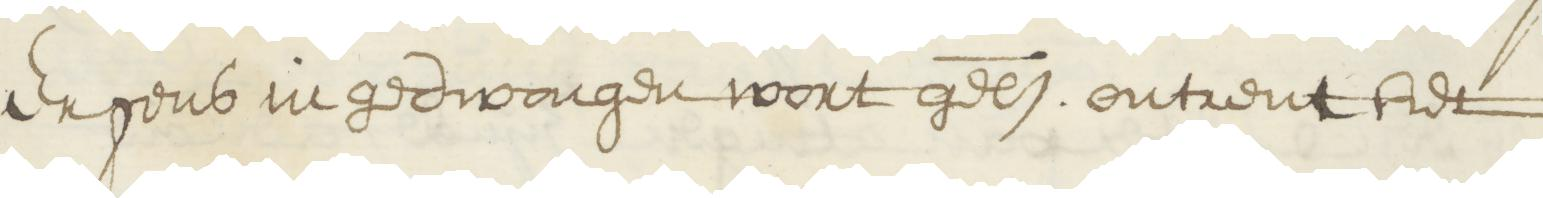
Ergens in gedwongen wort gelijk ontrent het
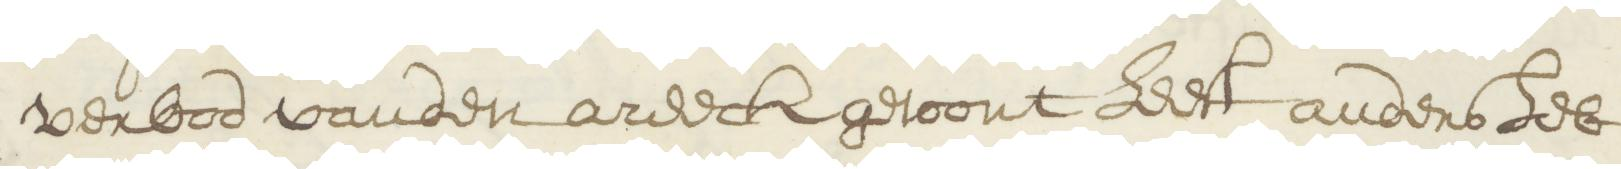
verbod vanden areeck getoont heeft anders heb
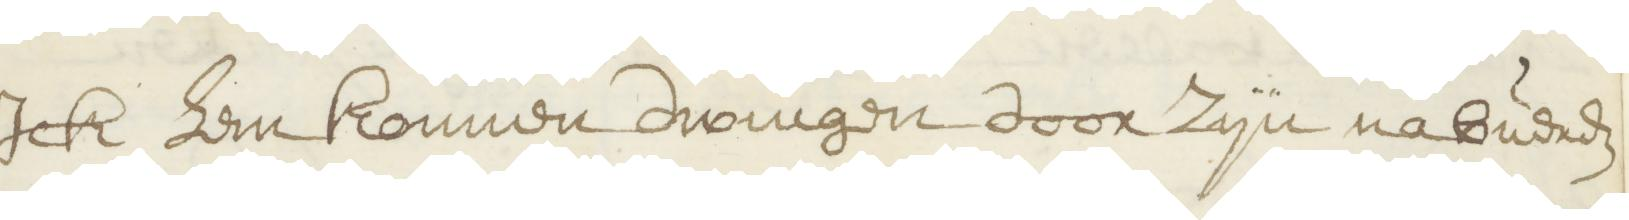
Jck hem konnen dwingen door zijn nabueren
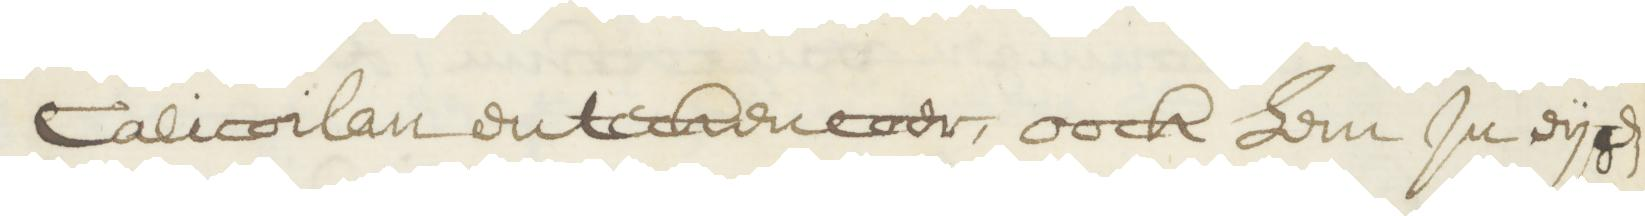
calicoilan en teckencoer, oock hem jn eijgen
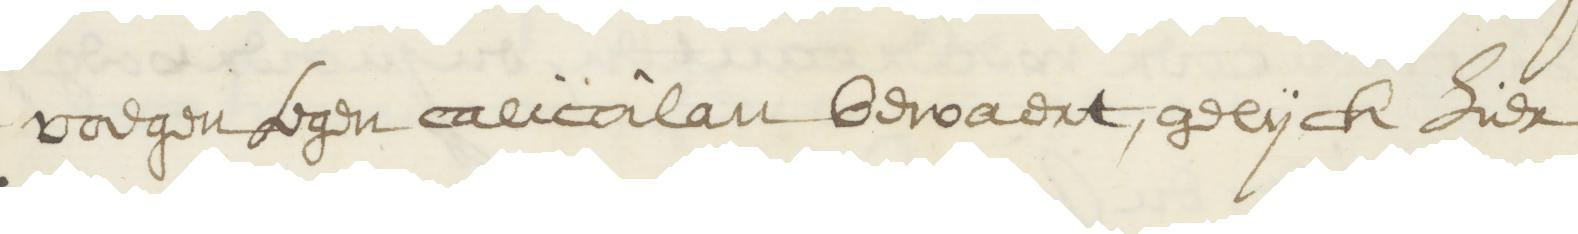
voegen tegen calicoilan bewaert, gelijck hier
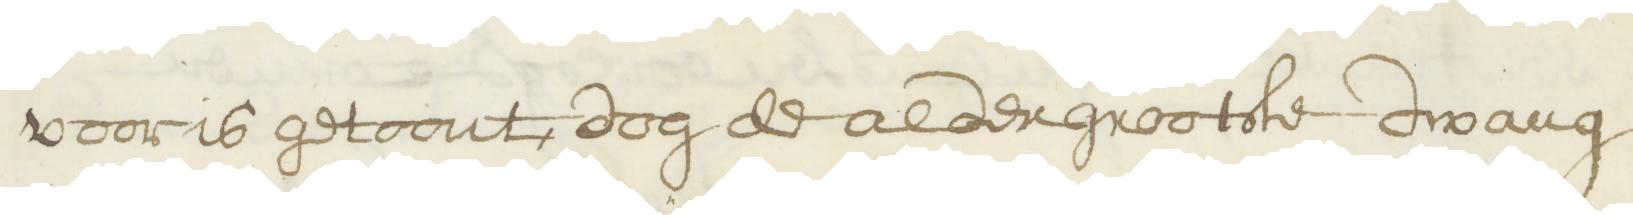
voor is getoont, dog de aldergrootste dwang
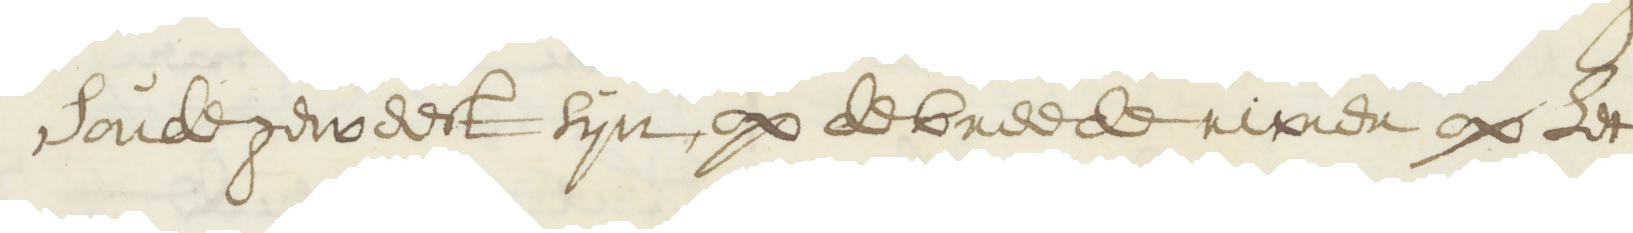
soude geweest sijn, op de breede rivier op het
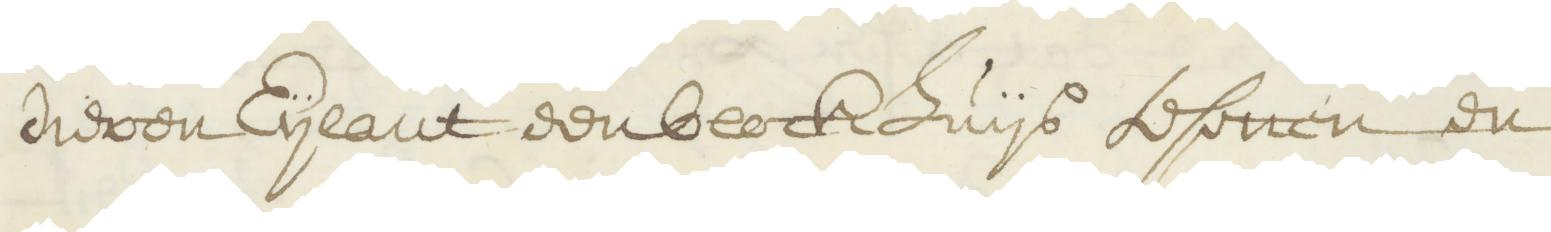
dieven Eijlant een blockhuijs tesetten en
